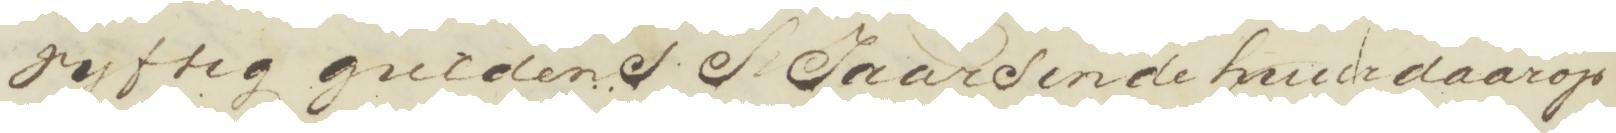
vyftig guldens S Iaars in de huur daarop
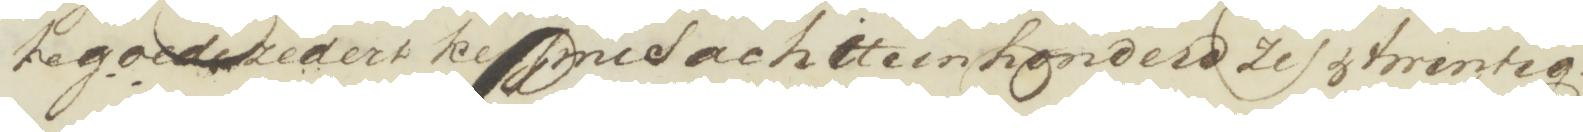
te goede zedert kesmis achttien honderd zes en twintig.
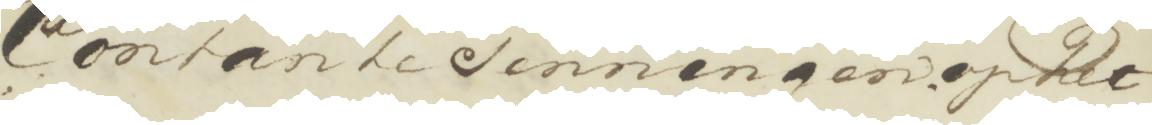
Contante Penningen op het
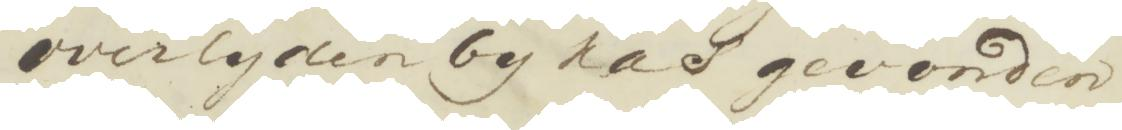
overlyden by kas gevonden
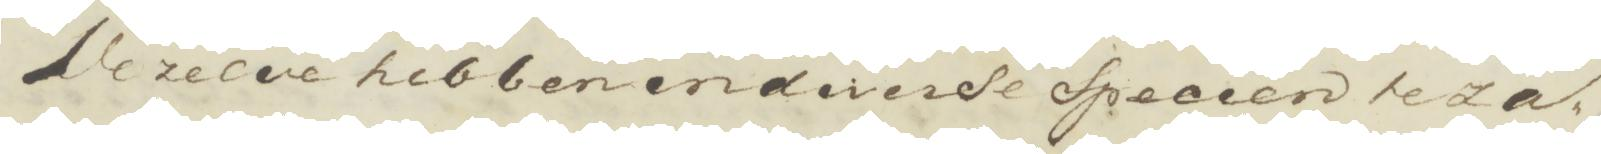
Dezelve hebben in diverse specien te za„
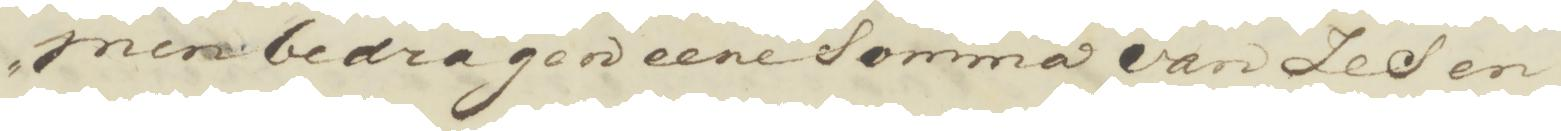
„men bedragen eene somma van Zes en
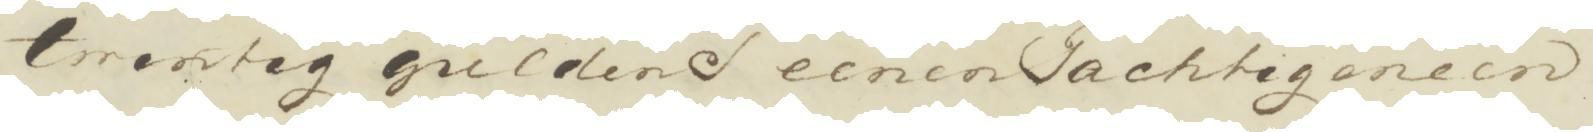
twintig guldens eenen Tachtig en een
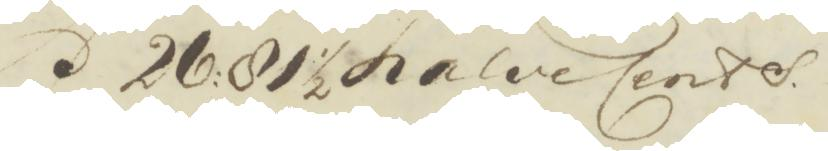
ƒ 26:81½ halve Cents.
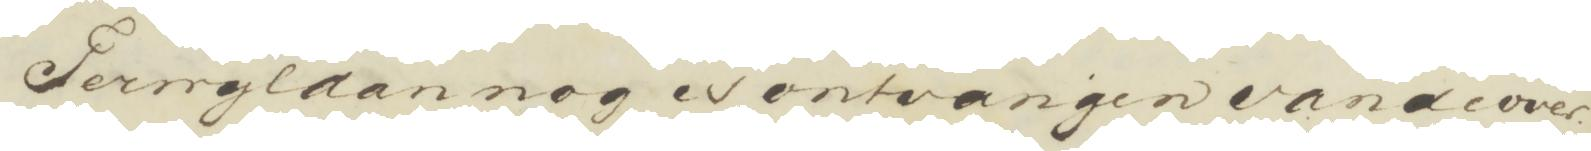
Terwyl dan nog is ontvangen van de over.
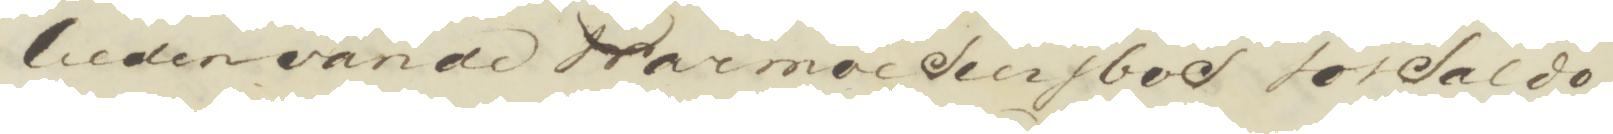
lieden van de Warmoesenbos tot saldo
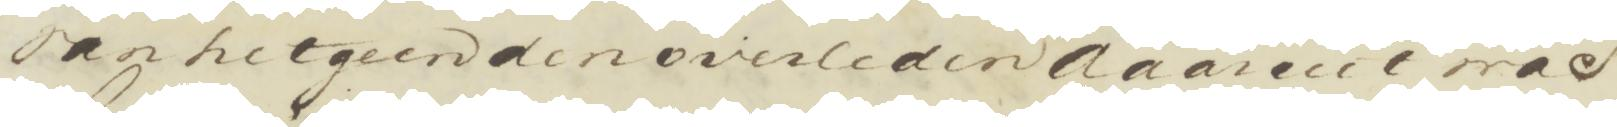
van hetgeen den overleden daaruit was
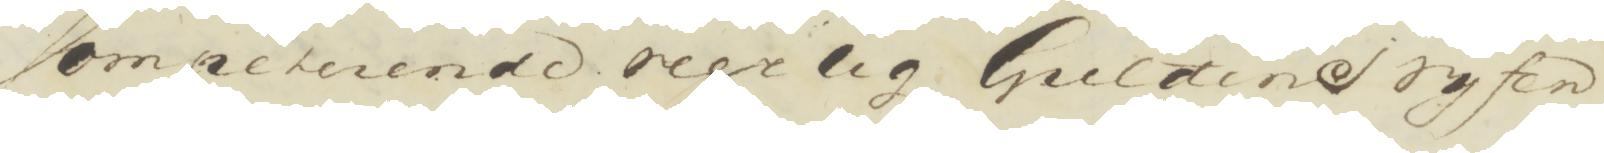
Competerende veertig Guldens vyfen
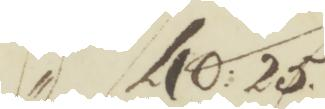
„ 40:25.
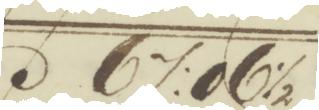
ƒ 67:06½
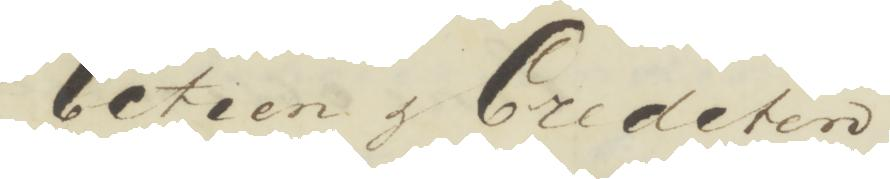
Actien & Crediten
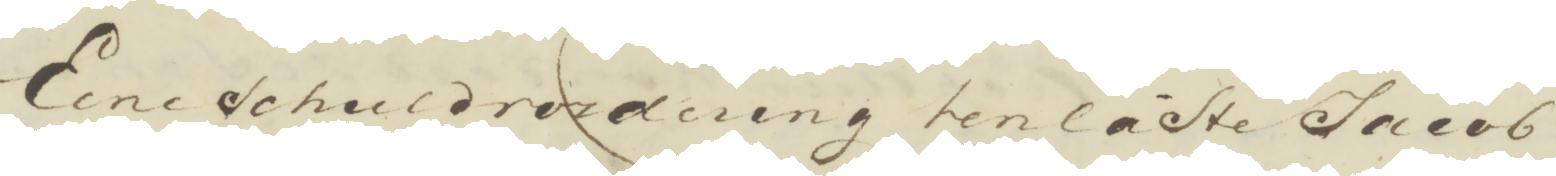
Eene schuldvordering ten laste Iacob
